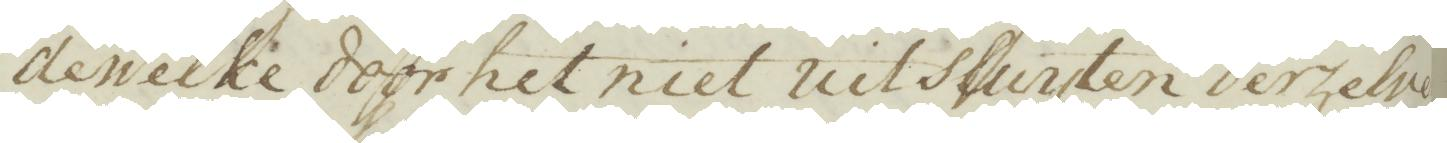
dewelke door het niet uitsluyten derzelve
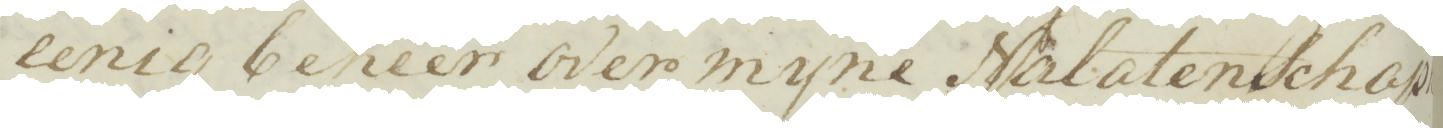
eenig beheer over myne Nalatenschap
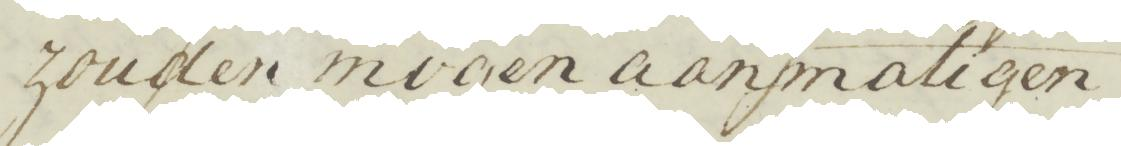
zouden mogen aanmatigen
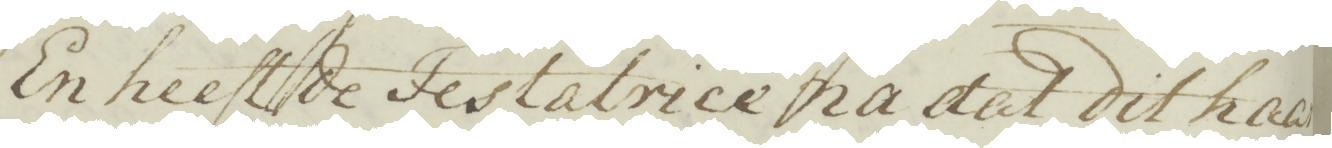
En heeft de Testatrice na dat dit haa
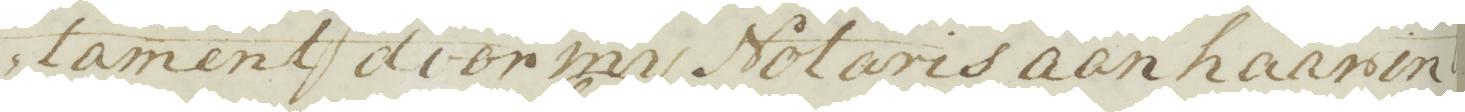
„tament door my Notaris aan haar in
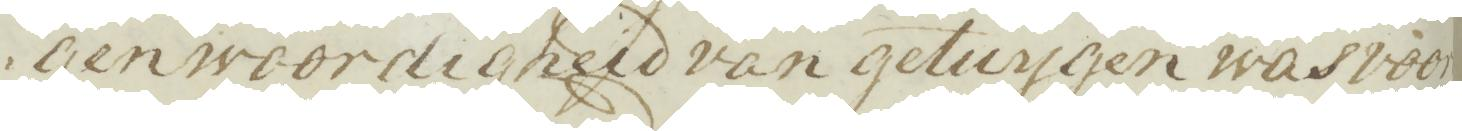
„genwoordigheid van getuygen was voor
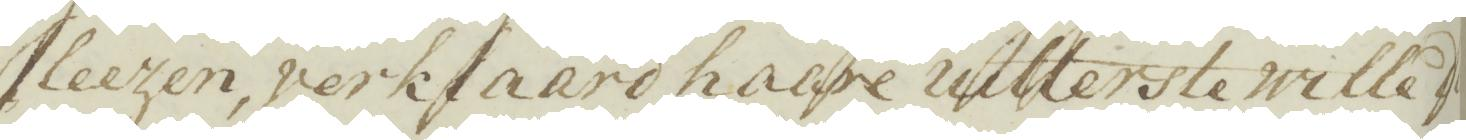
leezen, verklaard haare uitterste wille d
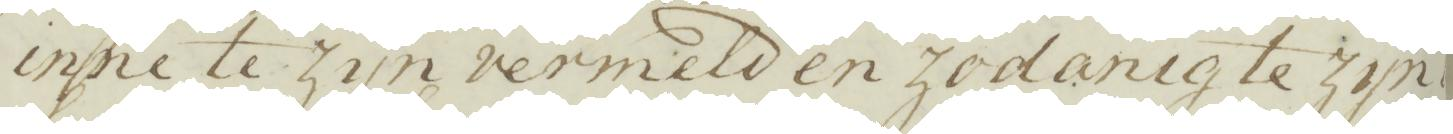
inne te zyn vermeld en zodanig te zyn
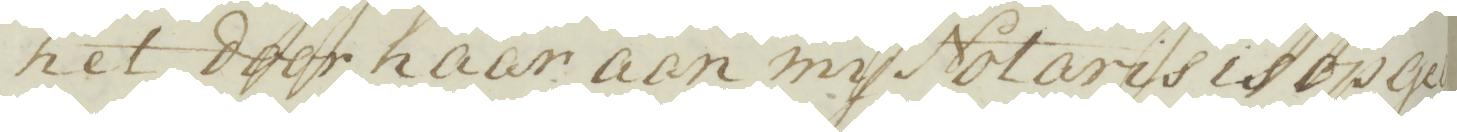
het door haar aan my Notaris is opge
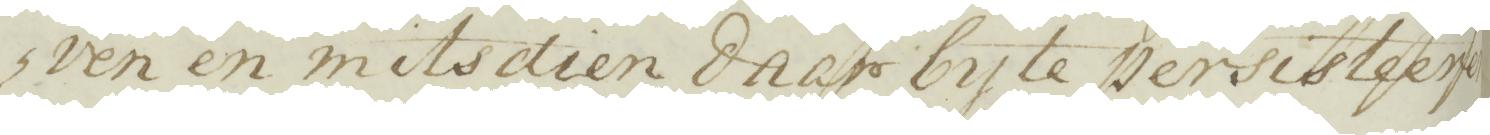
„ven en mitsdien daar by te persisteere
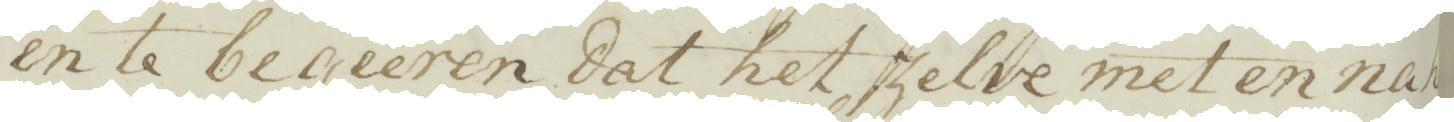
en te begeeren dat het zelve met en na
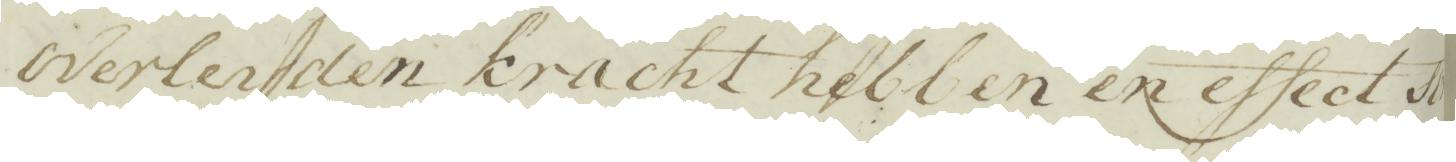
overleyden kracht hebben en effect s
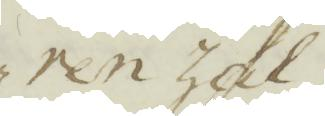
„ren zal
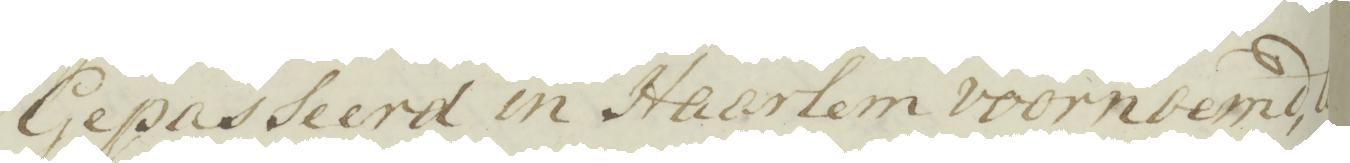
Gepasseerd in Haarlem voornoemd,
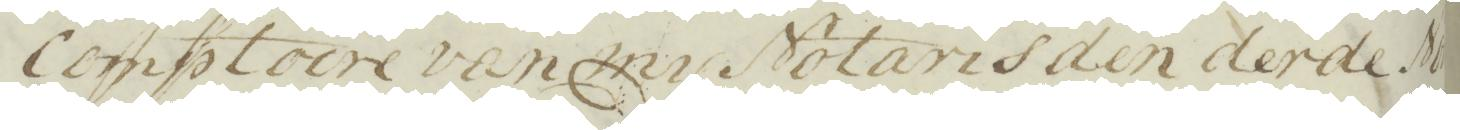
comptoire van my Notaris den derde No
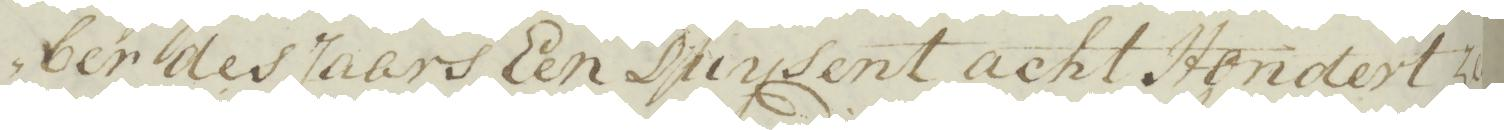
„ber des Jaars Een Duysent acht Hondert ze
